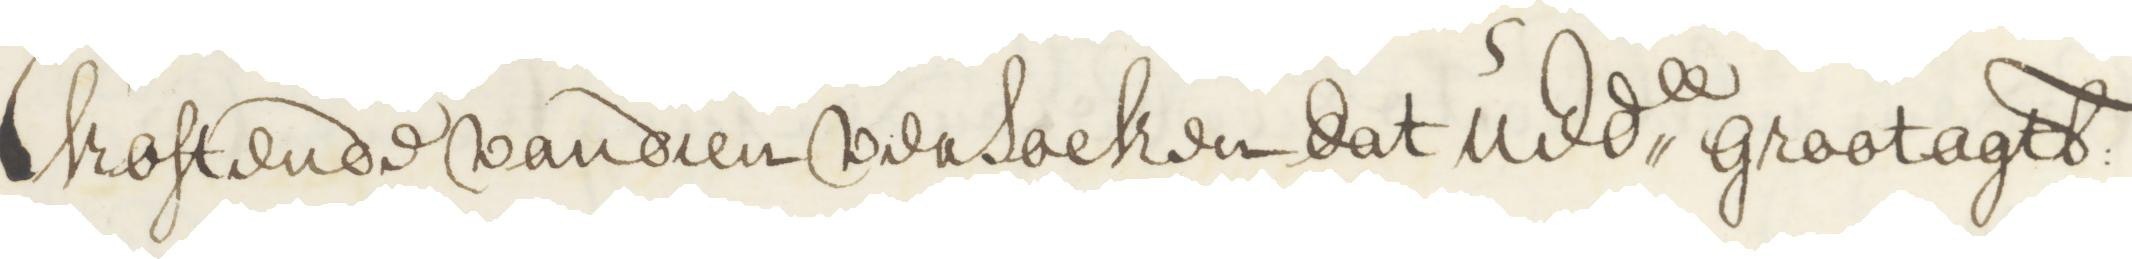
'tkostende van dien versoeken dat uEd„le groot agtb:
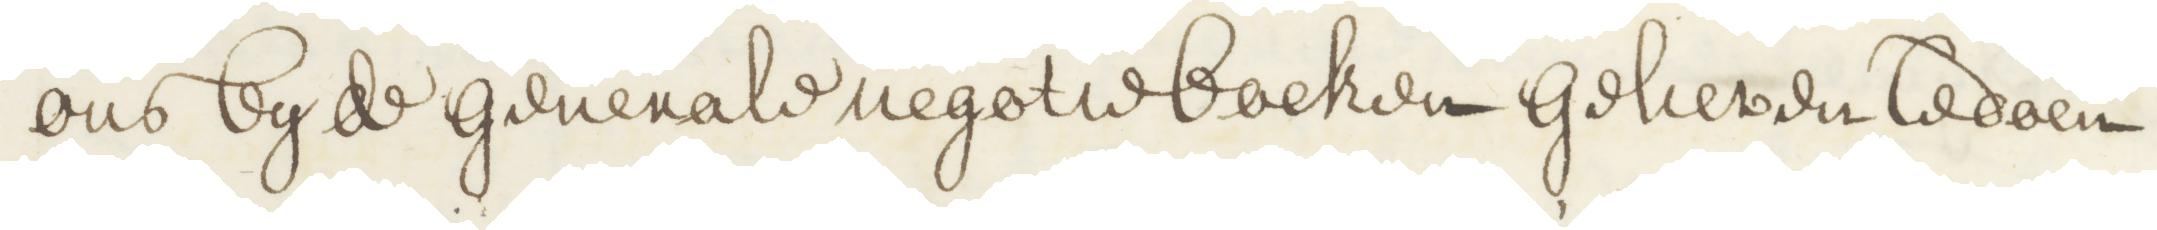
ons by de generale negotieboeken gelieven te doen
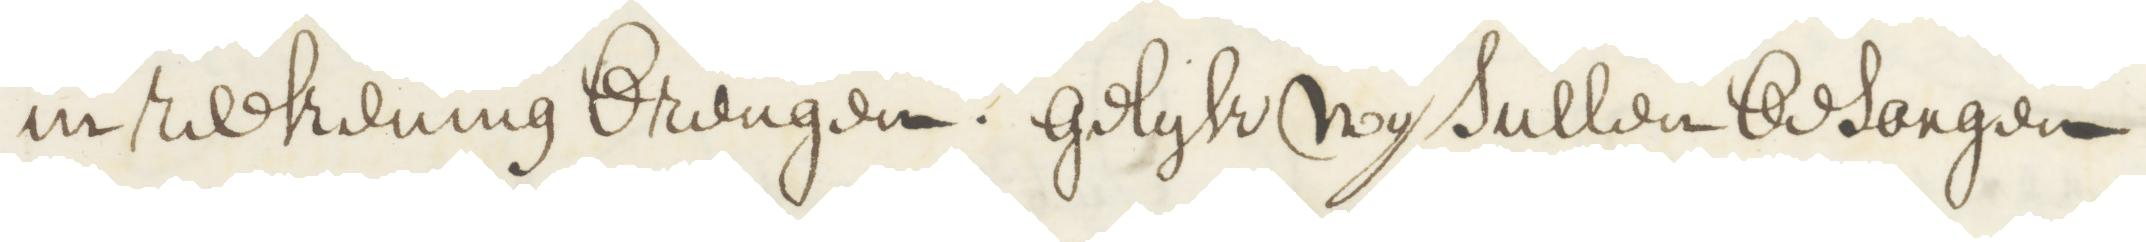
in reekening brengen; gelyk wy sullen besorgen
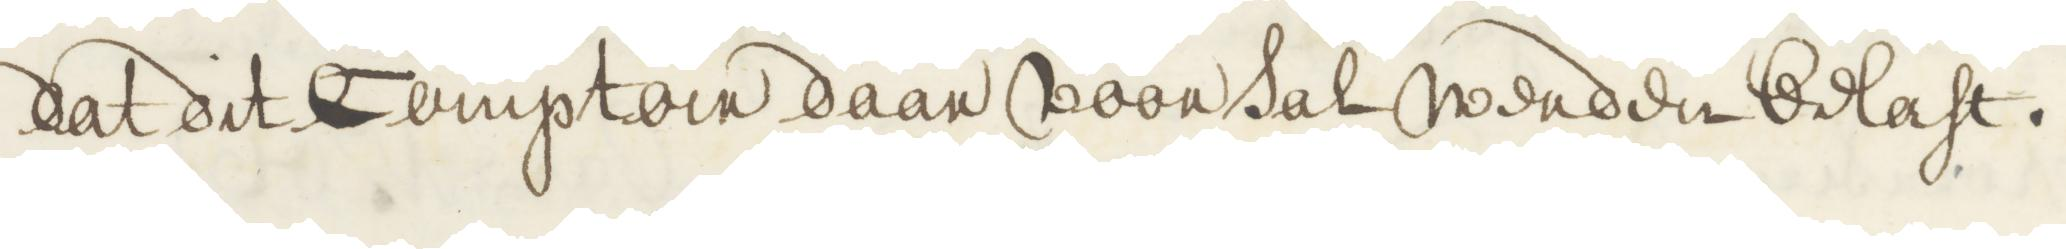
dat dit Comptoir daar voor sal werden belast.
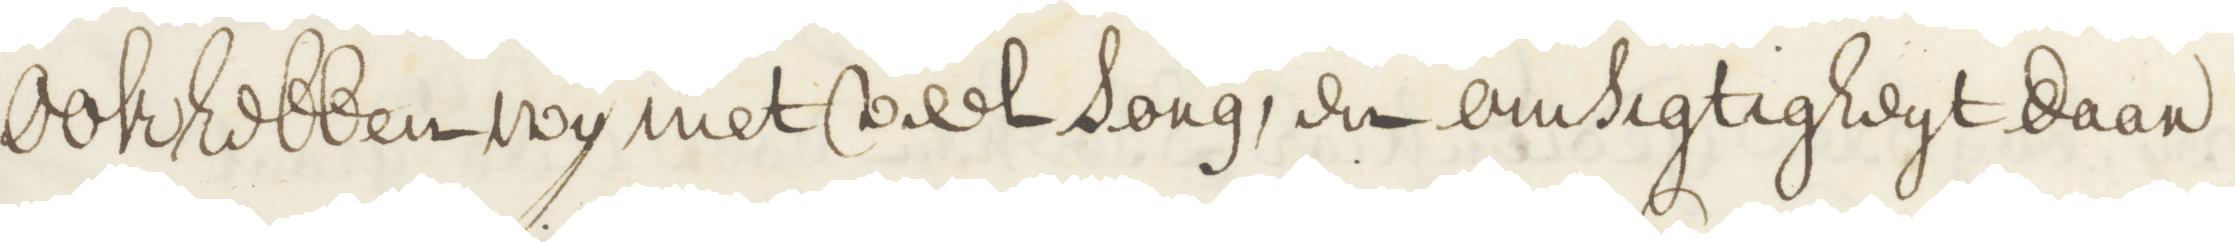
Ook hebben wij met veel sorg, en omsigtigheijt daar
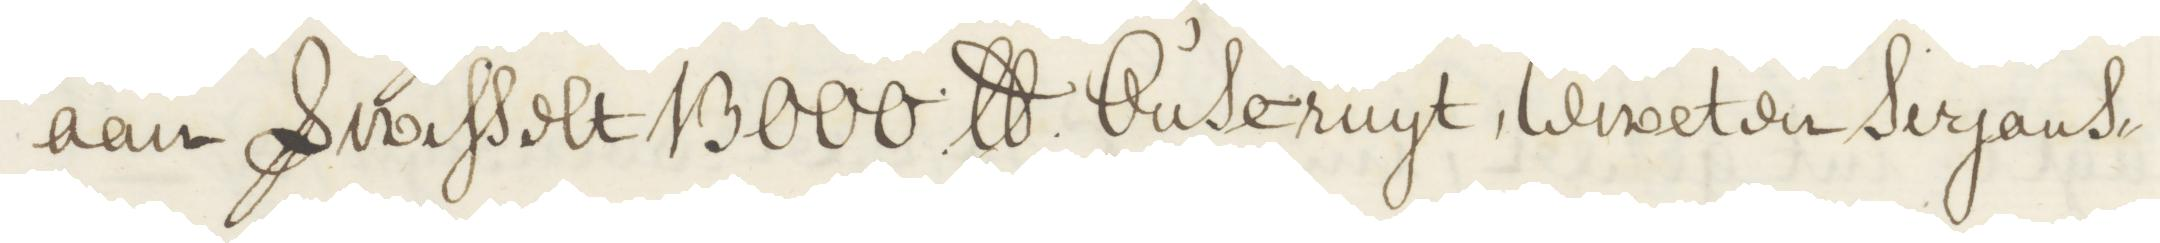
aan verwisselt 13000: lb. buscruyt, teweten Serjans„
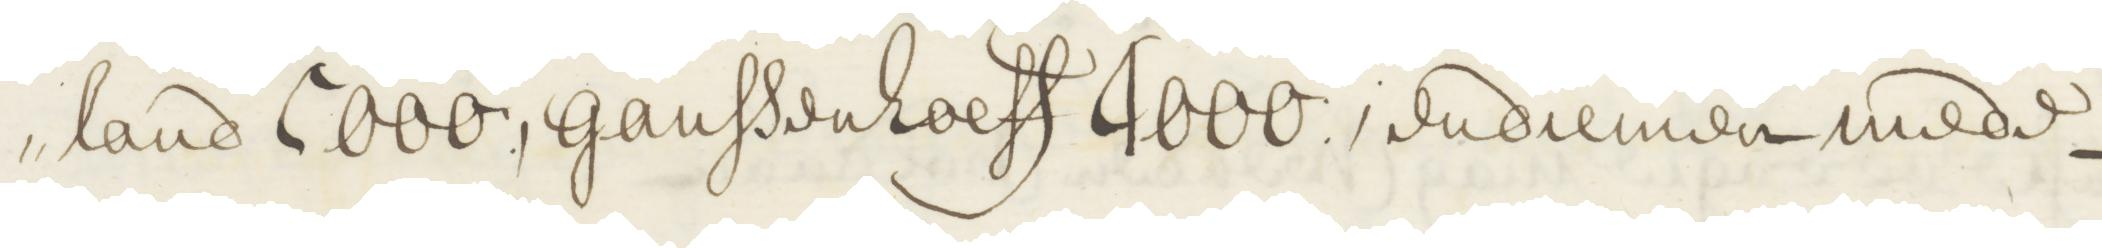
„land 5000., ganssenhoeff 4000: ; en diemen mede
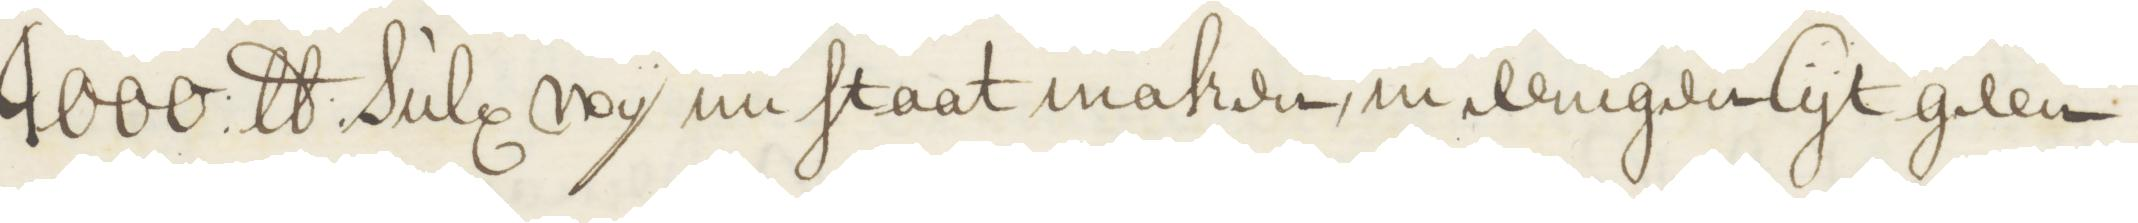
4000. lb: sulx wij nu staat maken; in eenigen tijt geen
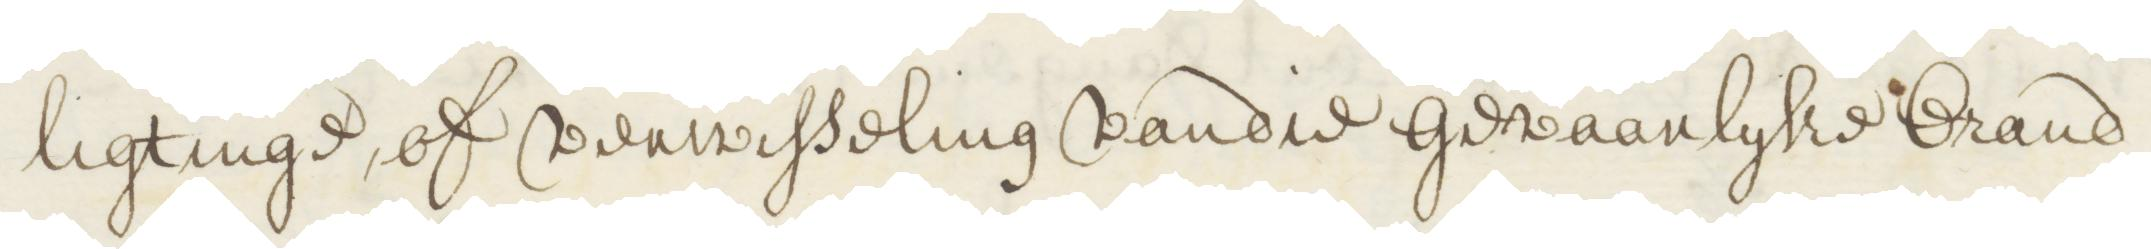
ligtinge, of verwisseling van die gevaarlijke brand
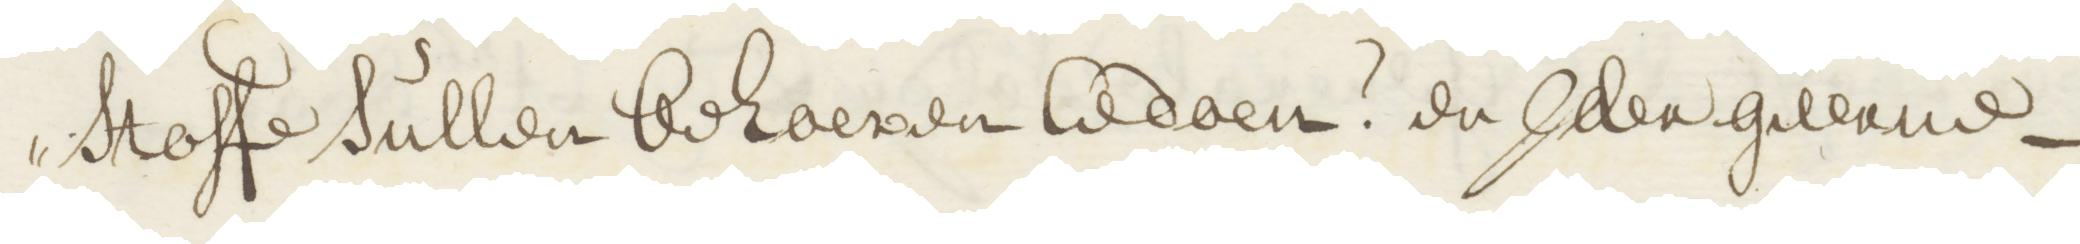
„stoffe sullen behoeven te doen; en jder geerne
